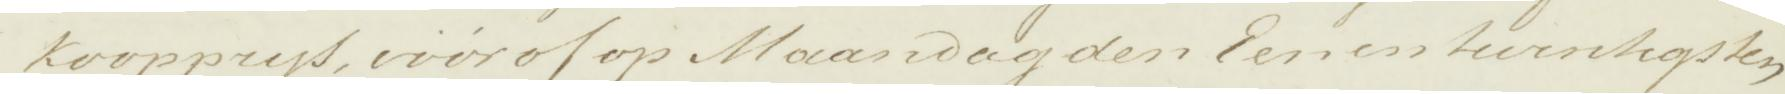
koopprys, vóór of op Maandag den Een en twintigsten
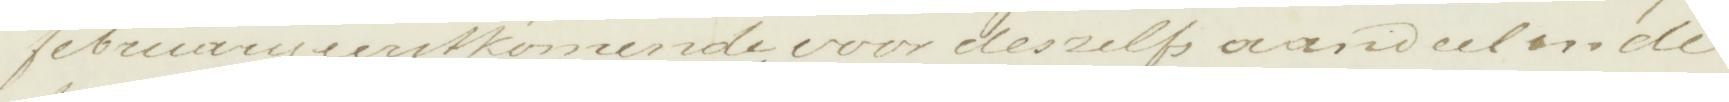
february eerstkomende, voor deszelfs aandeel en de
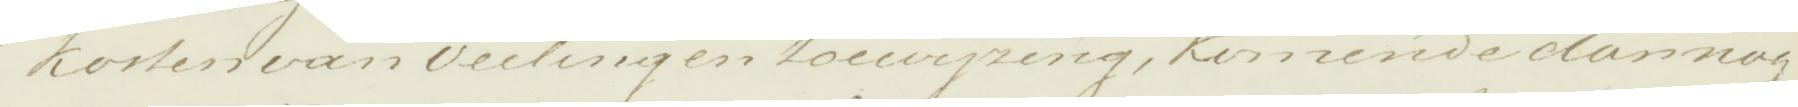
kosten van veiling en toewyzing, komende dan nog
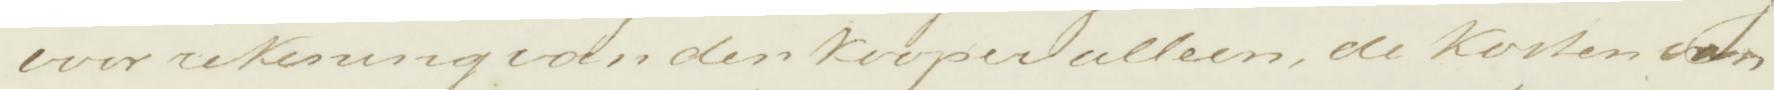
voor rekening van den kooper alleen, de kosten van
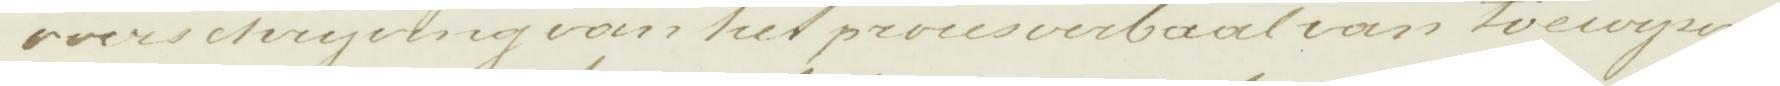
voorschryving van het procesverbaal van toewyzing
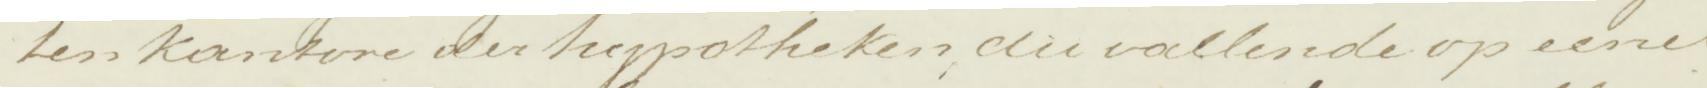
ten kantore der hypotheken, die vallende op eene
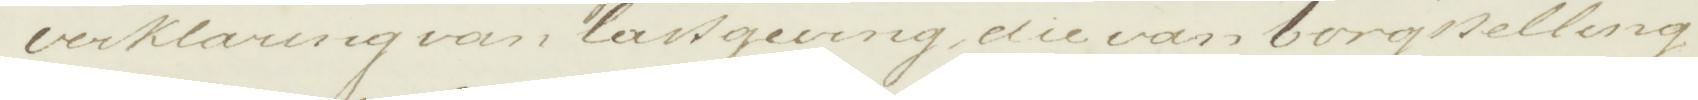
verklaring van lastgeving, die van borgstelling
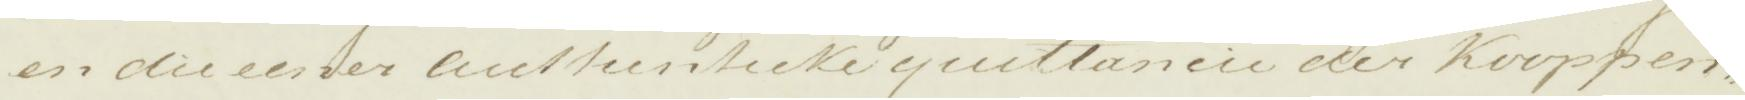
en die eener authentieke quittancie der Kooppen„
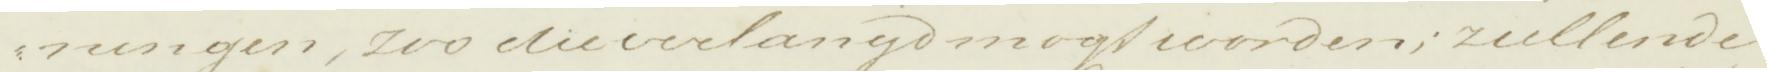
„ningen, zoo die verlangd mogt worden; zullende
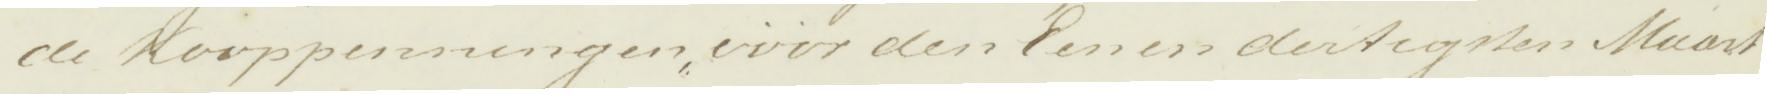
de Kooppenningen, voor den Een en dertigsten Maart
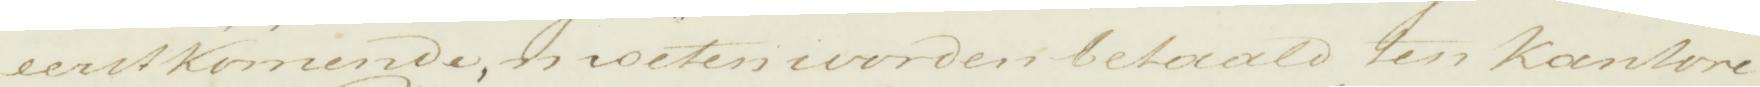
eerstkomende, moeten worden betaald ten kantore
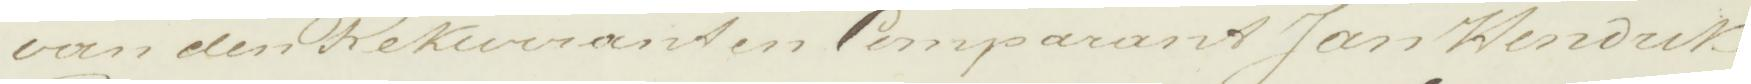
van den Rekwirant en Comparant Jan Hendrik
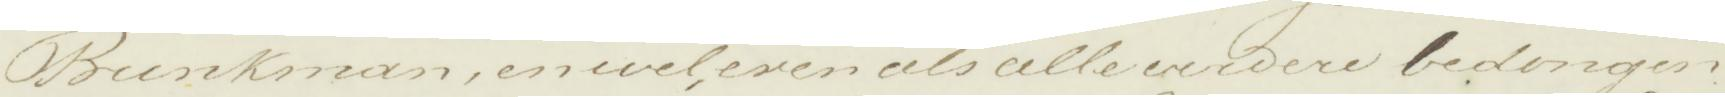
Brinkman, en wel, even als alle verdere bedongen
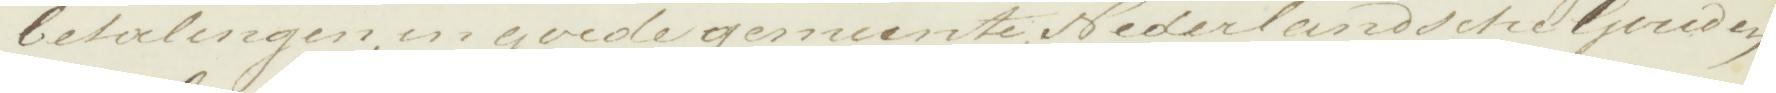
betalingen, in goede gemeente, Nederlandsche Gouden
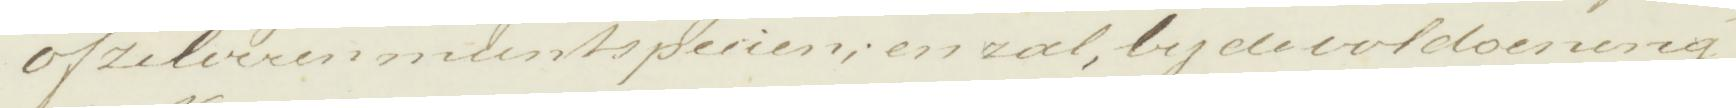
of zilveren muntspecien; en zal, by de voldoening
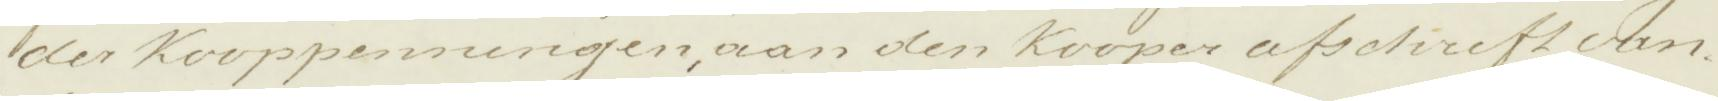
der kooppenningen, aan den kooper afschrift van
